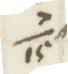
7/15„
